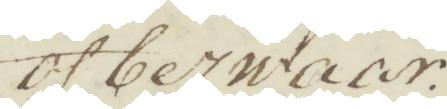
of bezwaar.
